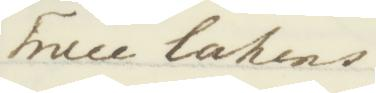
Twee lakens
